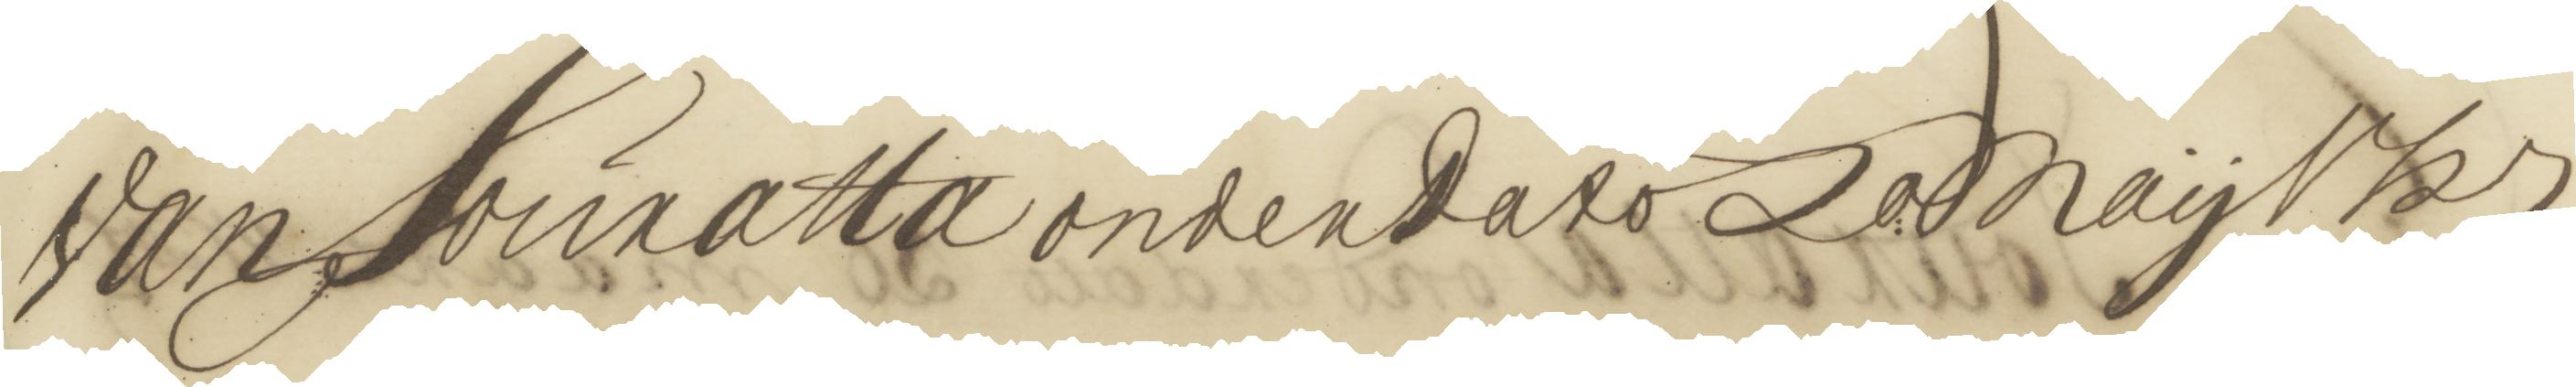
Van Souratta onder Dato 20: Maij 1727
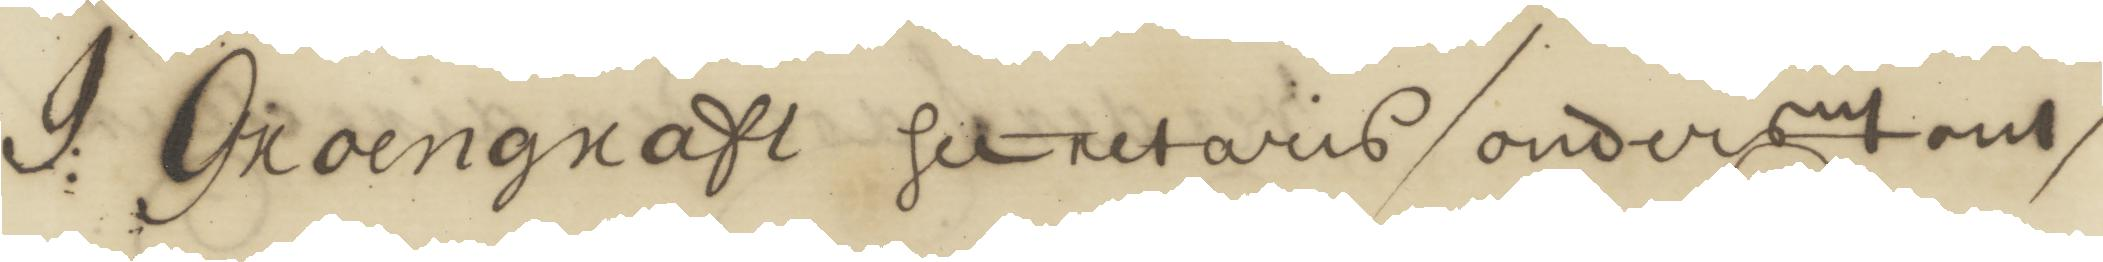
9: Groengraft secretaris /onderstont/
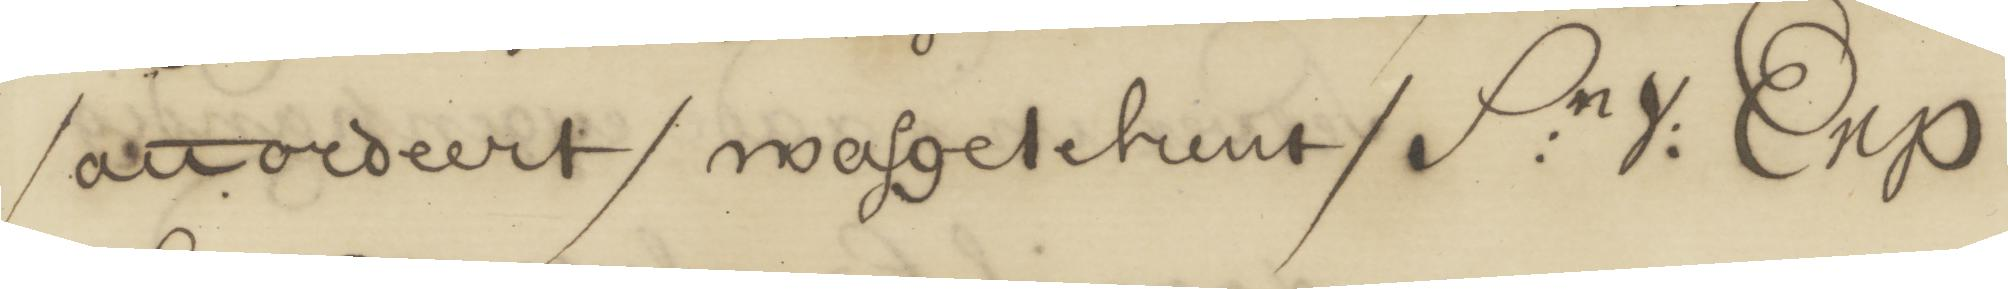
/accordeert / wasgetekent/ S:n V:Erp
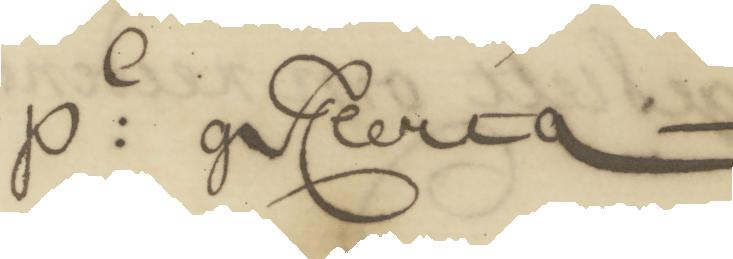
p:s gEclercq
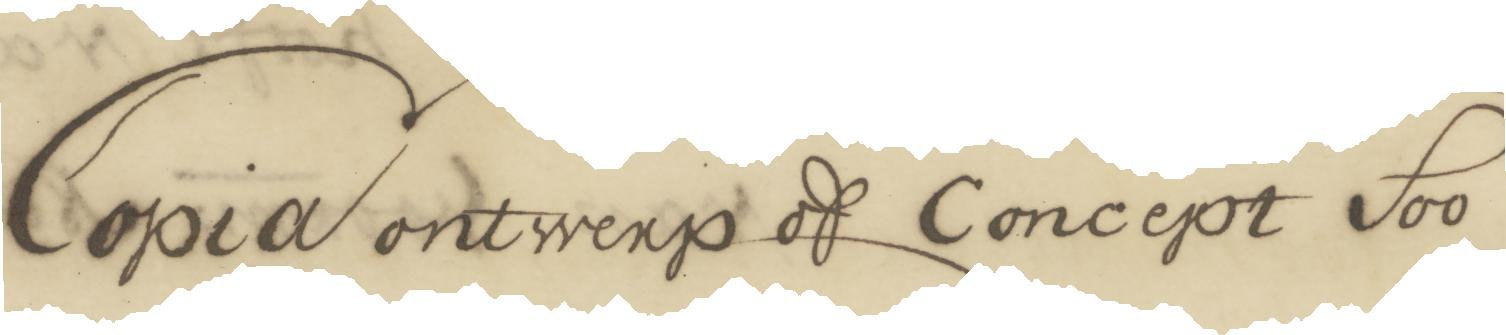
Copia ontwerp of Concept soo
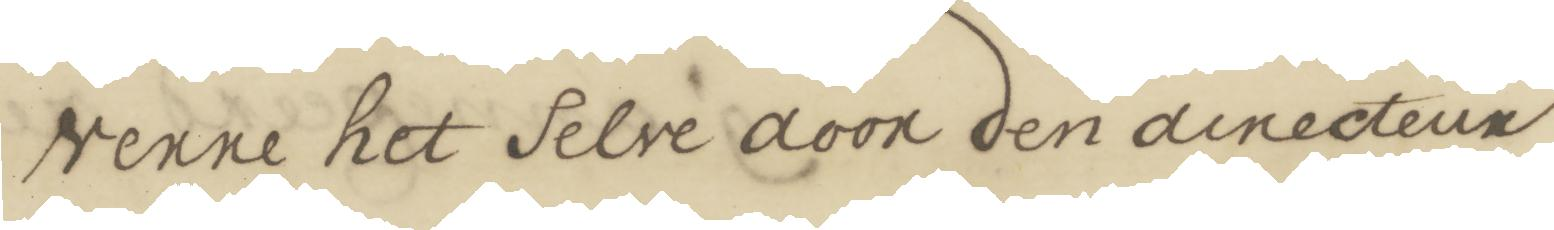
verre het selve door den directeur
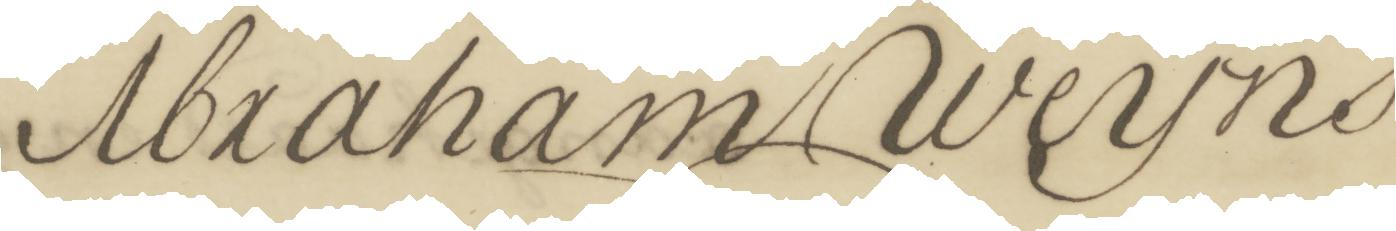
Abraham Weijns
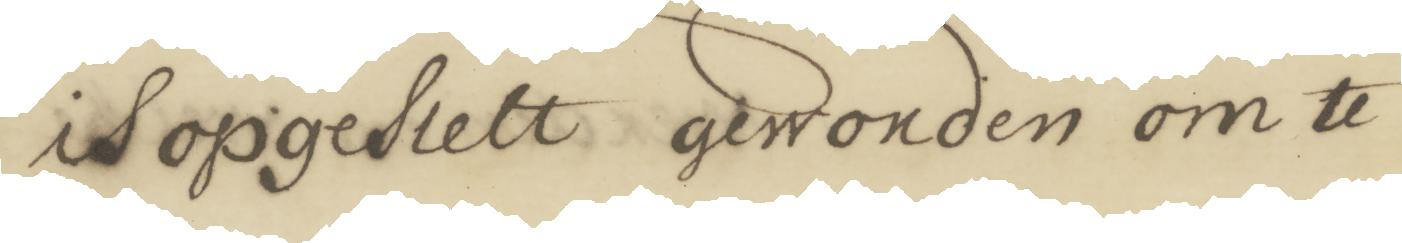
is opgestelt geworden om te
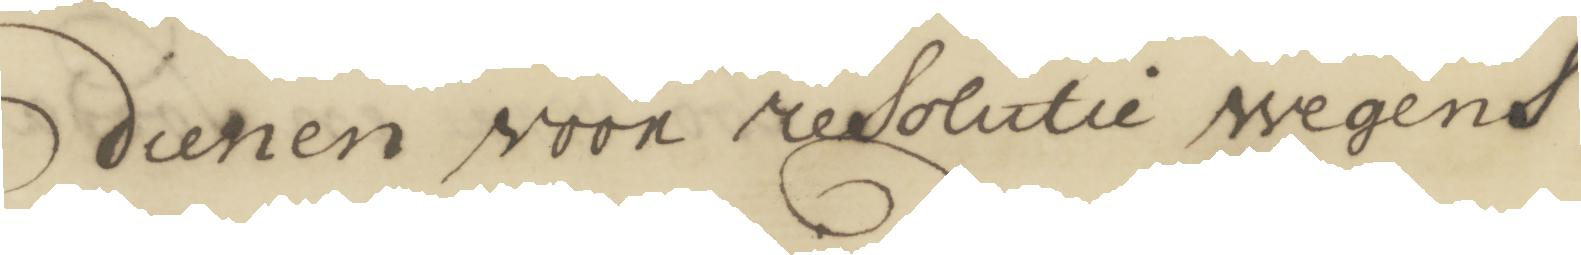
dienen voor resolutie wegens
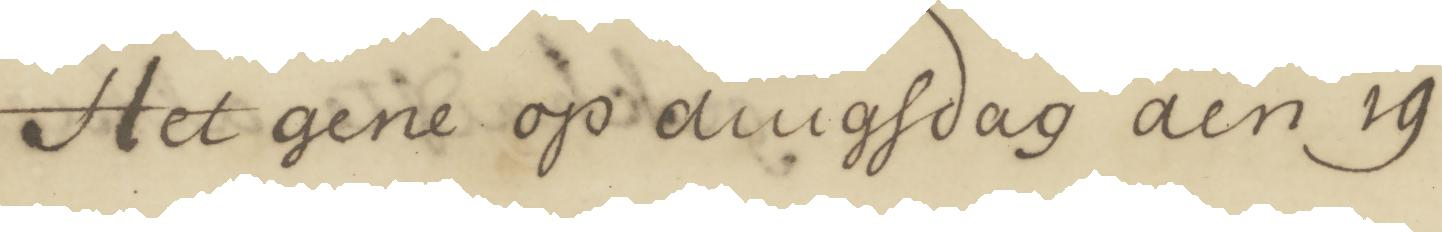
Het gene op dingsdag den 19
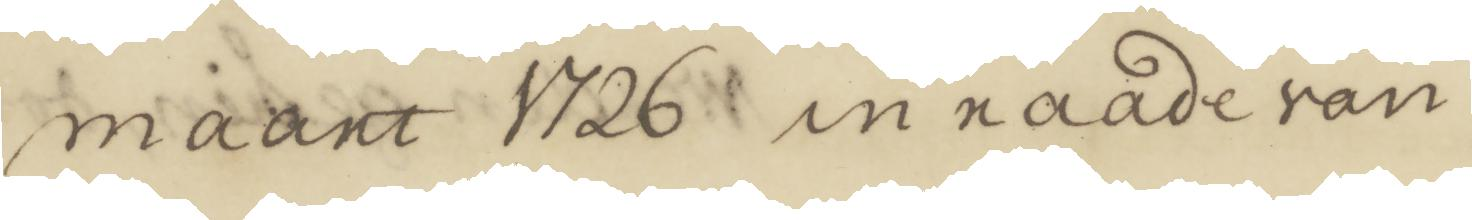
maart 1726 in raade van
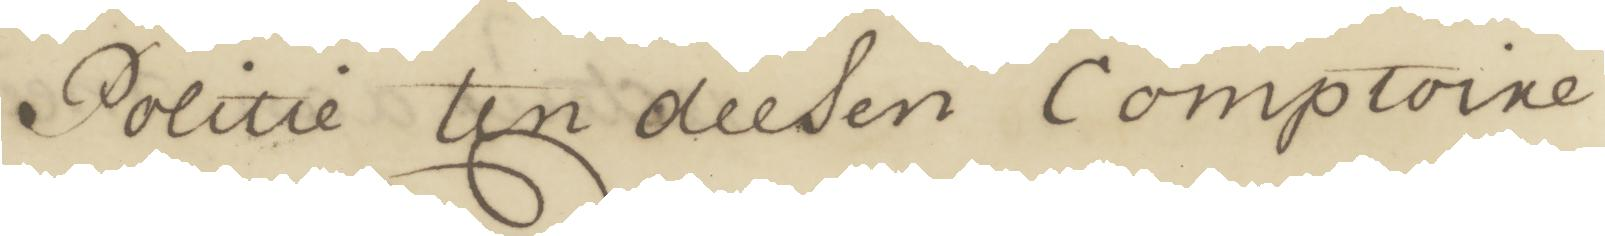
Politie ten deesen Comptoire
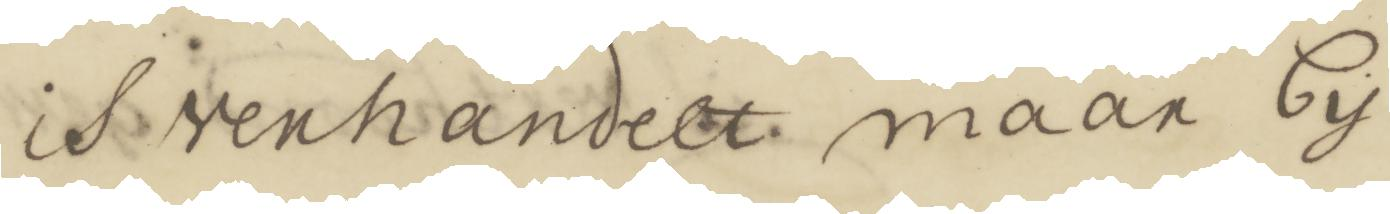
is verhandelt maar bij
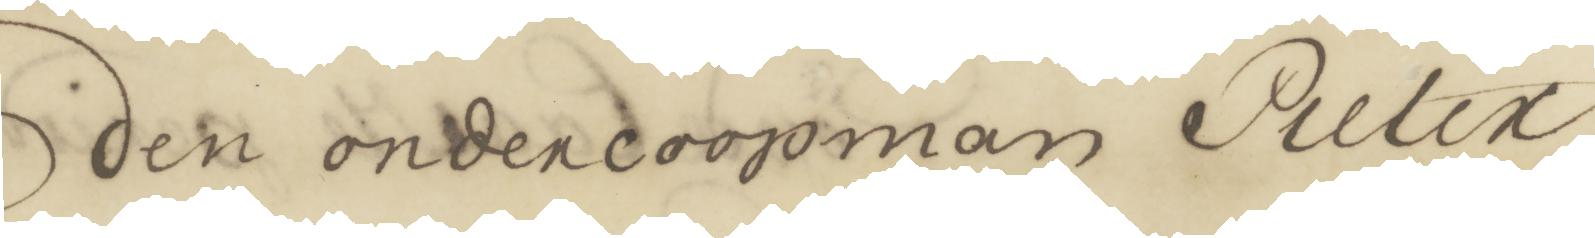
den ondercoopman Pieter
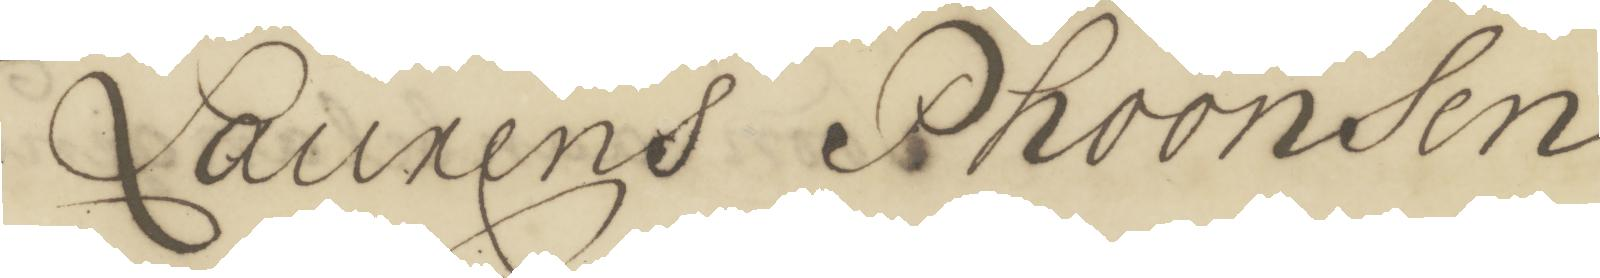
Laurens Phoonsen
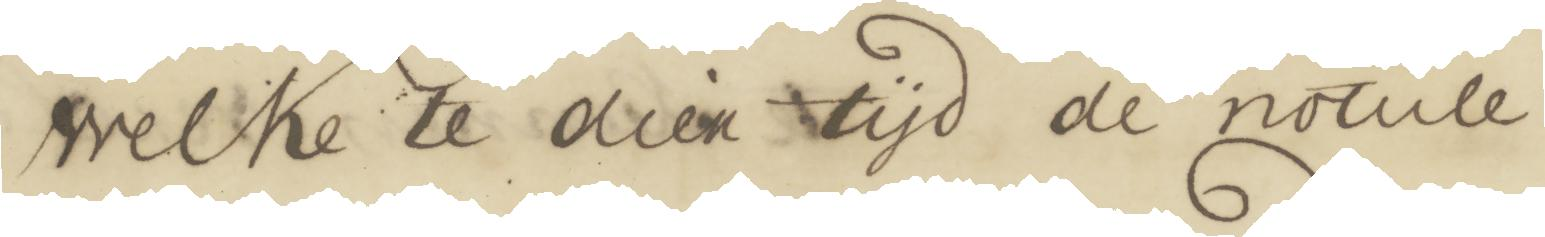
welke te dier tijd de notule
